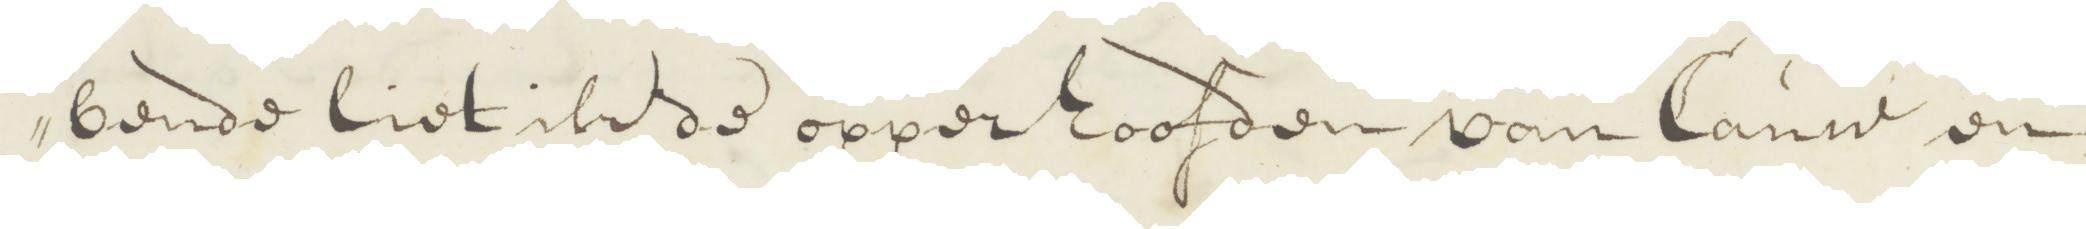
„bende liet ik de opperhoofden van Cauw en
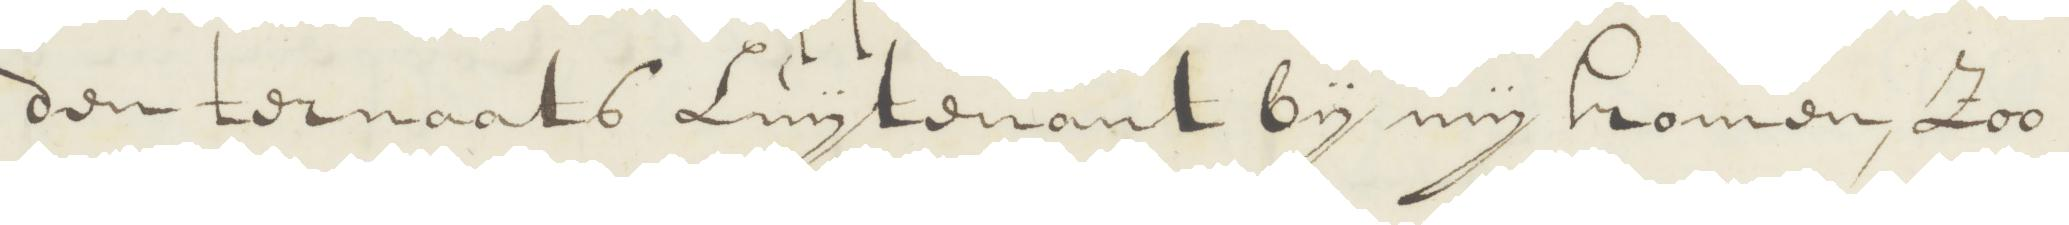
den ternaats Luijtenant bij mij komen, Zoo
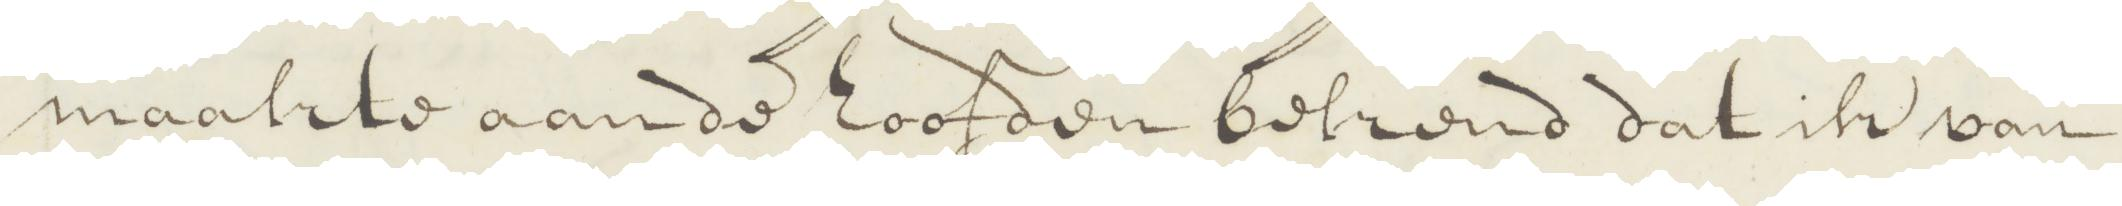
maakte aan de hoofden bekend dat ik van
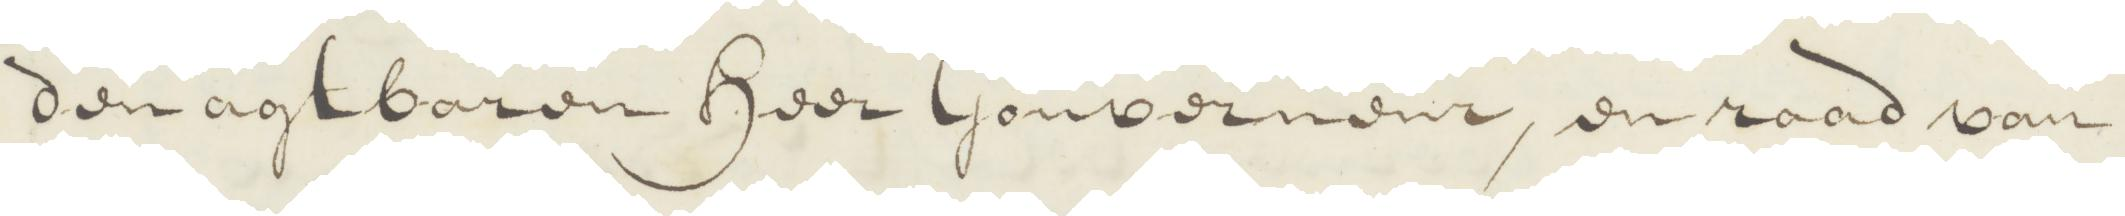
den agtbaren Heer Gouverneur, en raad van
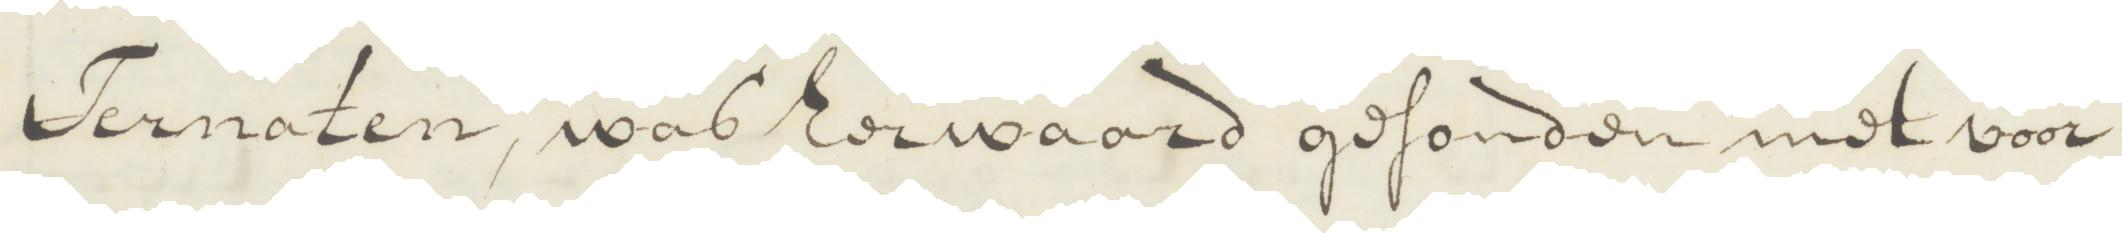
Ternaten, was herwaard gesonden met voor
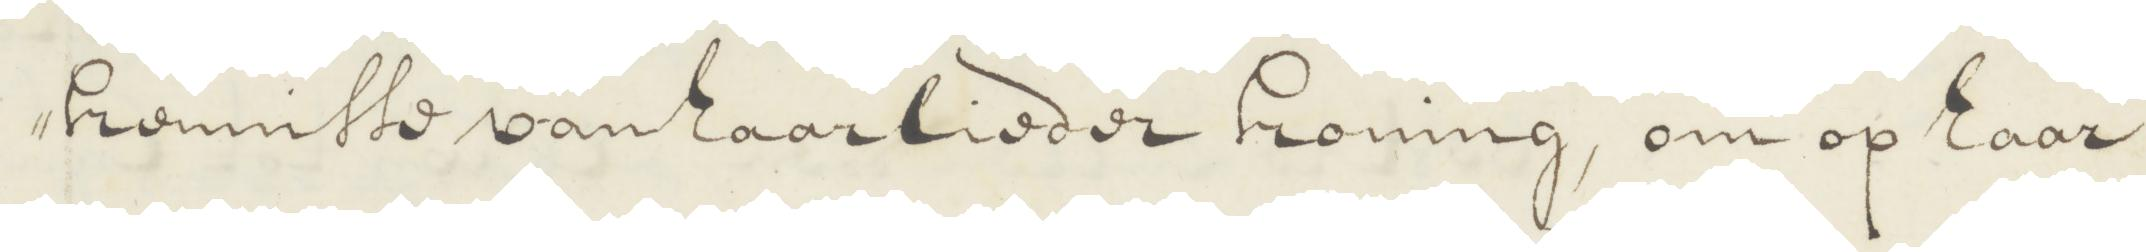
„kennisse van haar lieder koning, om op haar
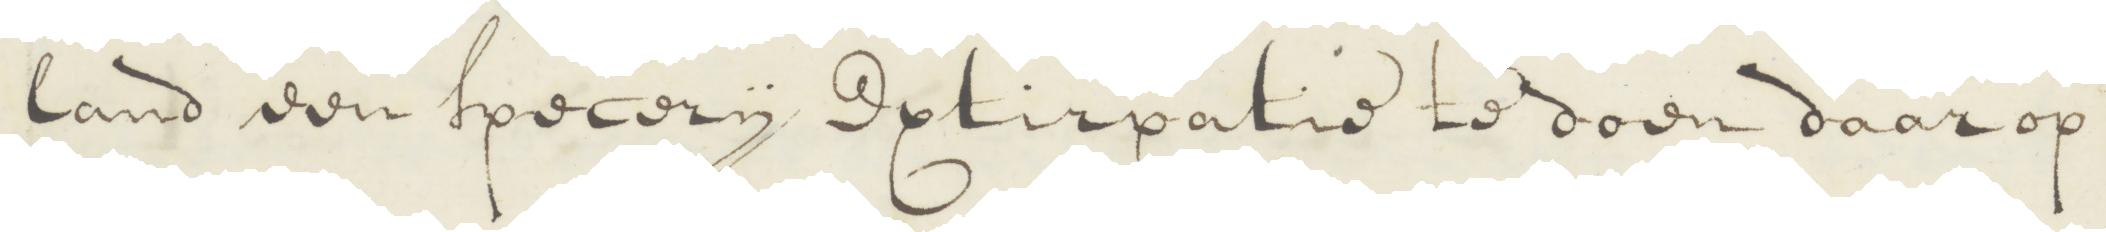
land een specerij Extirpatie te doen daar op
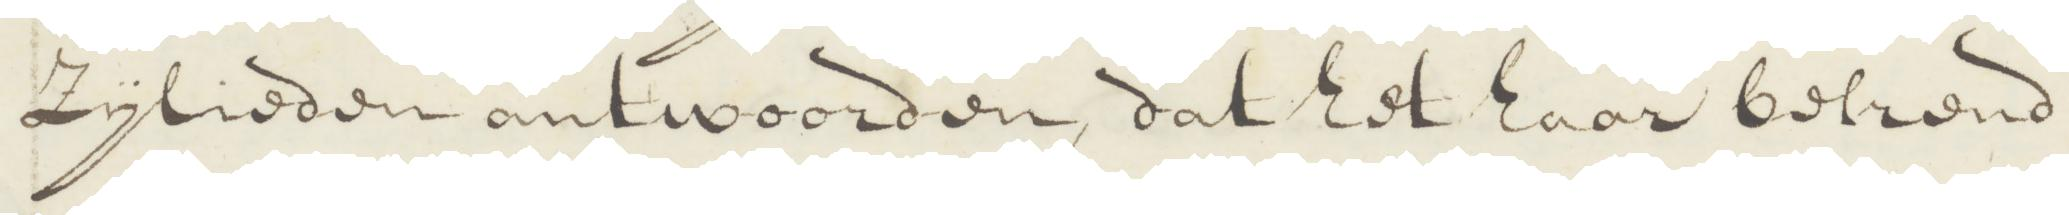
Zijlieden antwoorden, dat het haar bekend
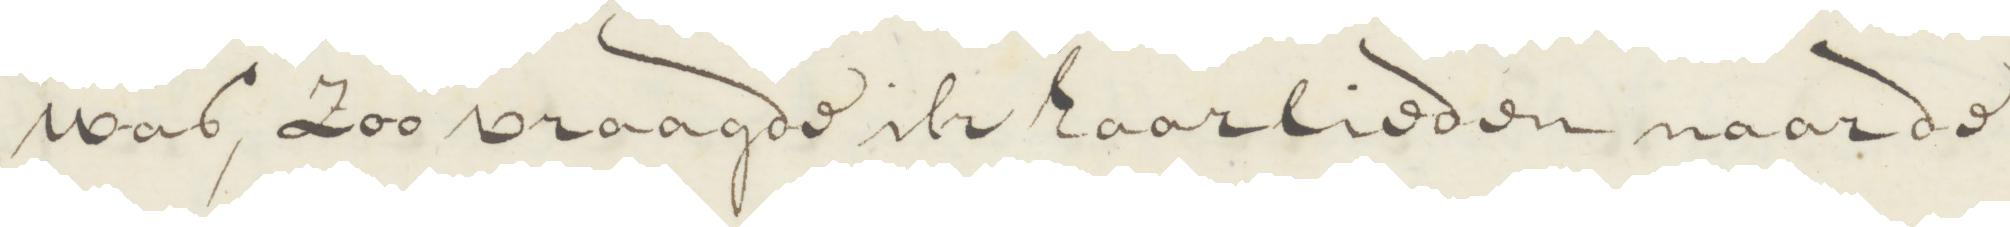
was, Zoo vraagde ik haarlieden naar de
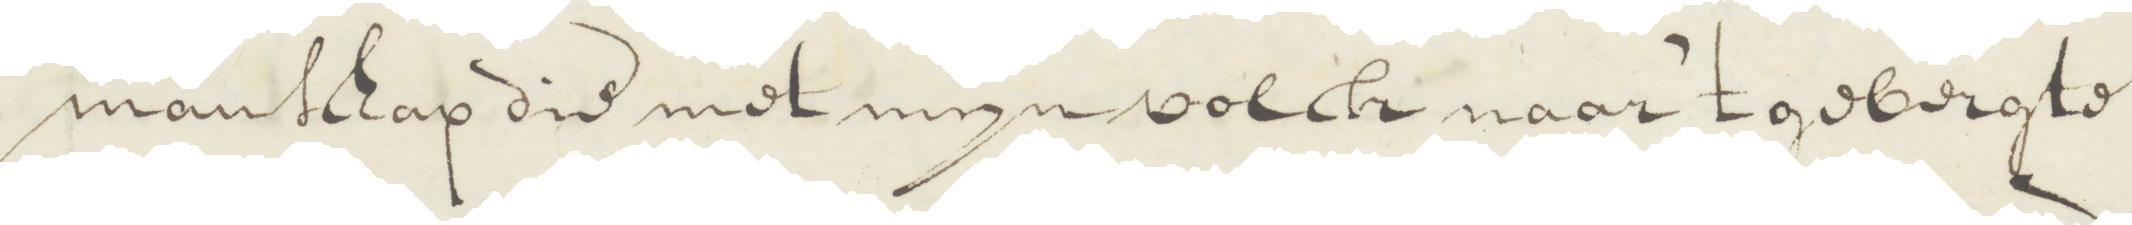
manschap die met mijn volck naar ’t gebergte
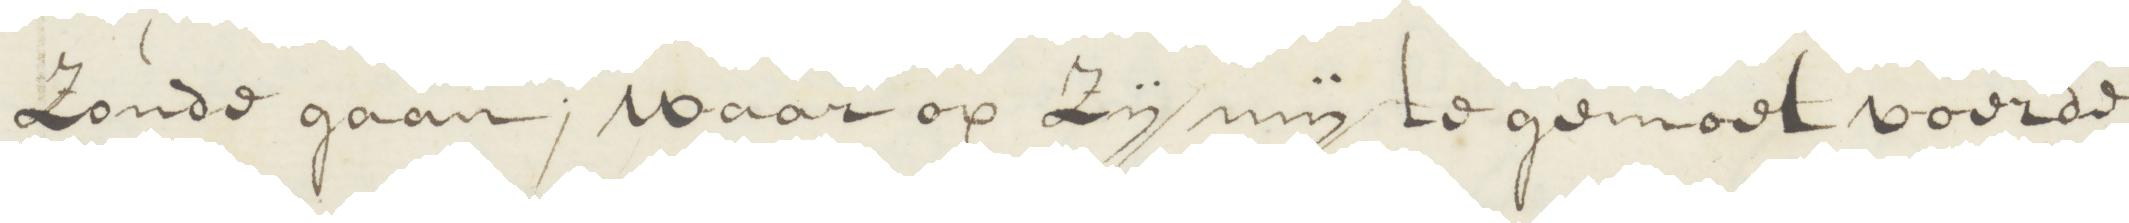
Zoude gaan; waar op zij mij te gemoet voerde,
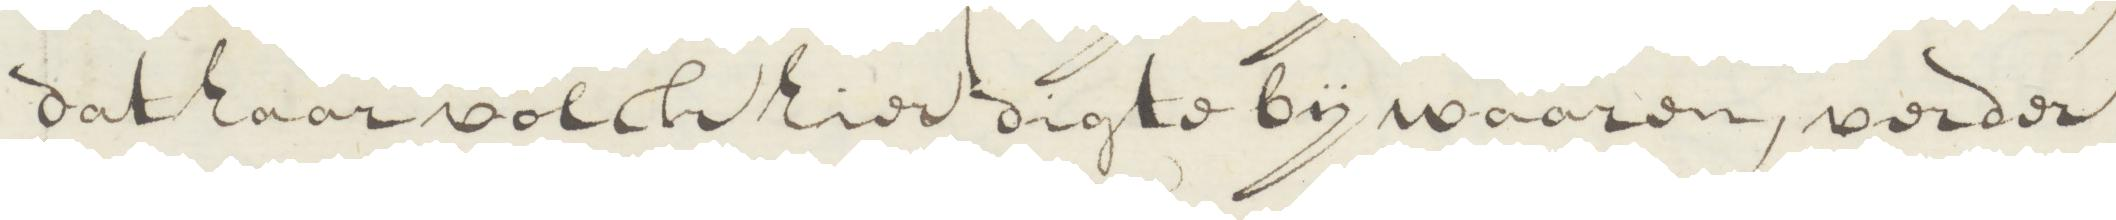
dat haar volck hier digte bij waaren, verder
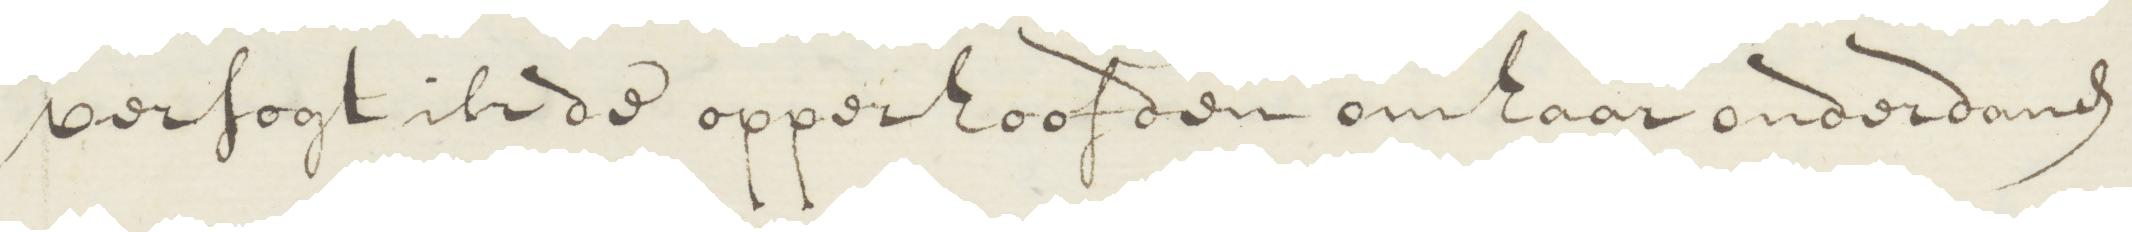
versogt ik de opperhoofden om haar onderdanen
